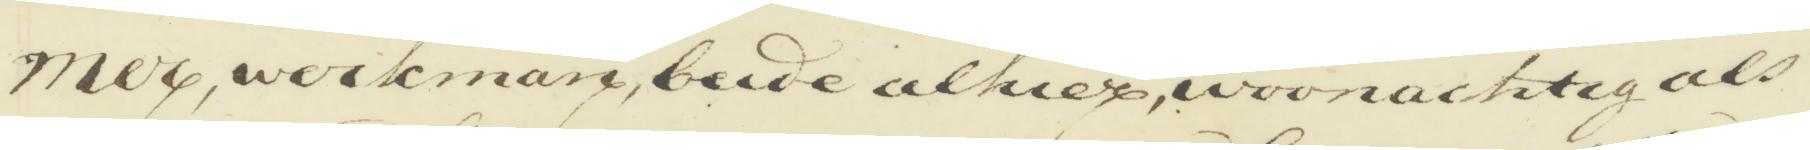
mer, werkman, beide alhier, woonachtig als
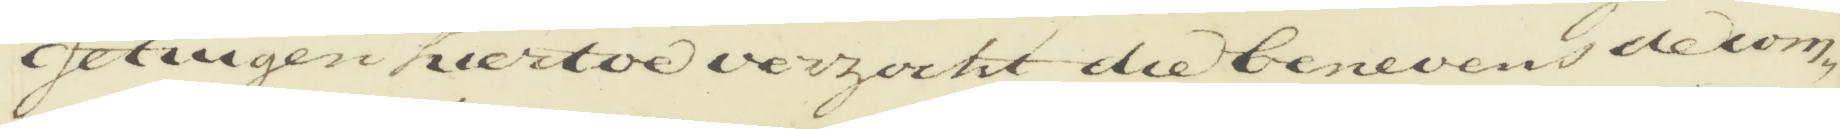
getuigen hiertoe verzocht die benevens de com„
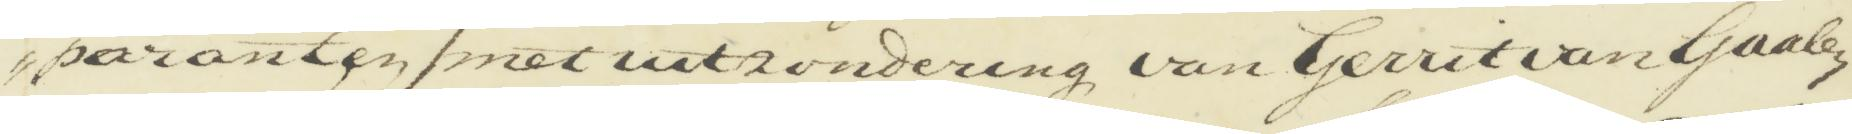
„paranten /met uitzondering van Gerrit van Gaalen
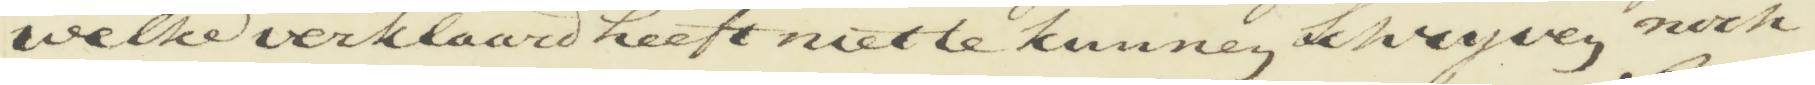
welke verklaard heeft niet te kunnen schryven noch
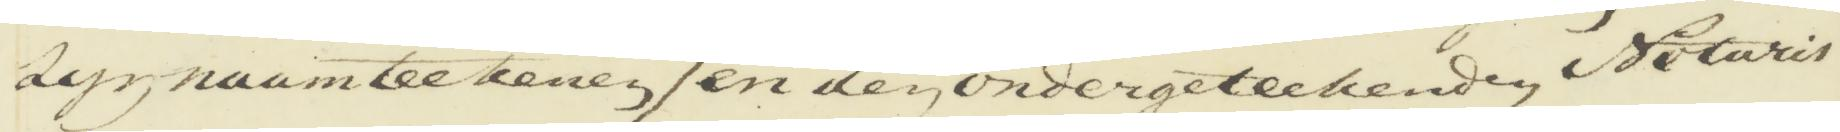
zyn naam teekenen/ en den ondergeteekenden Notaris
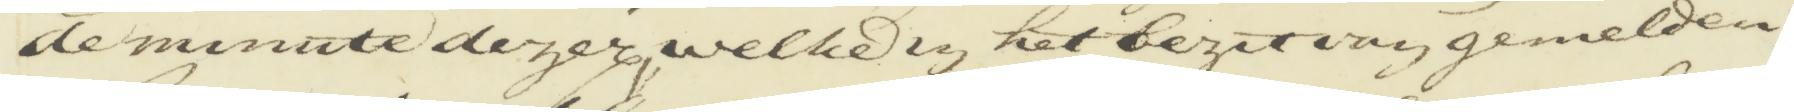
de minute dezer, welke in het bezit van gemelden
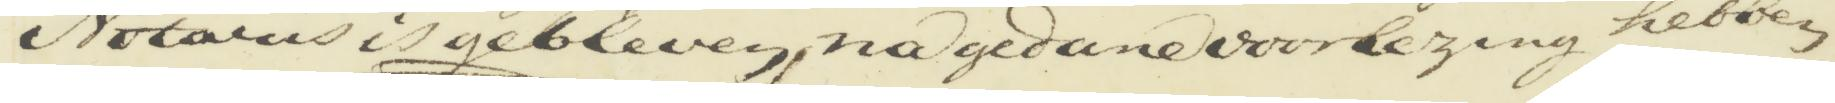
Notaris is gebleven, na gedane voorlezing hebben
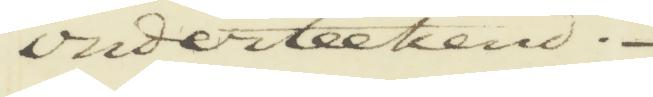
onderteekend.-
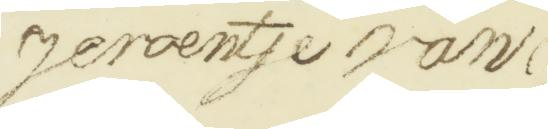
Jeroentje van
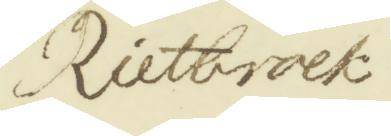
Rietbroek
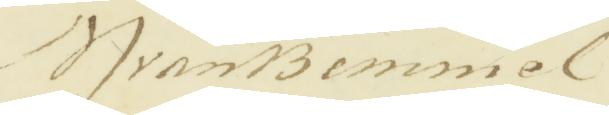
M vanBemmel
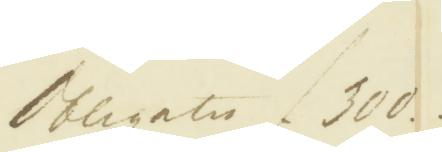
Obligatie ƒ 300.
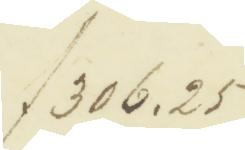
ƒ 306,25
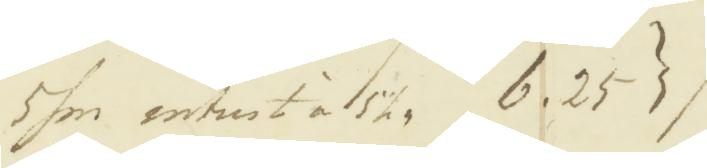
5/m intrest à 5% 6,25
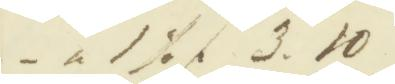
- „ 1% ƒ 3.10.
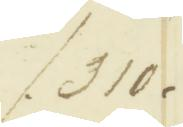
ƒ 310.
